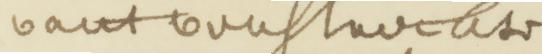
van 't verstreckte
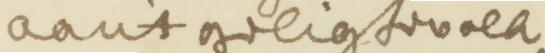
aan 't geligte volk
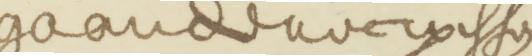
gaande recipissen
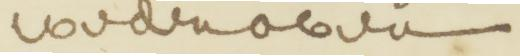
weder over
